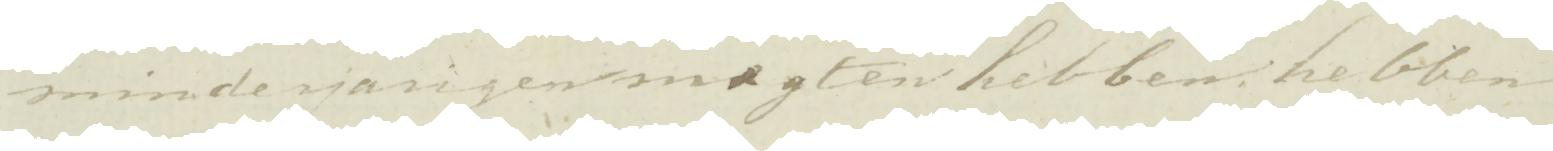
minderjarigen mogten hebben, hebben
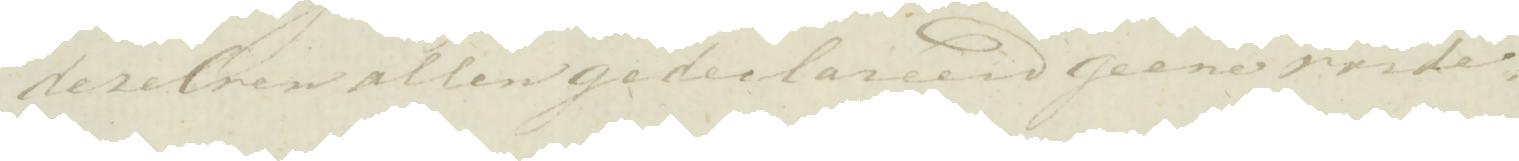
dezelven allen gedeclareerd geene vorde„
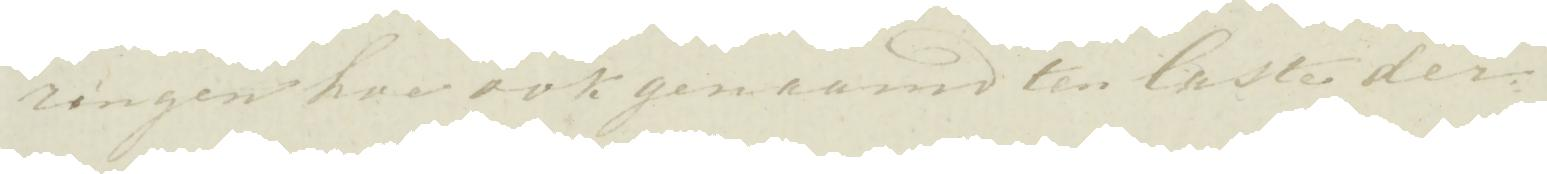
ringen hoe ook genaamd ten laste der
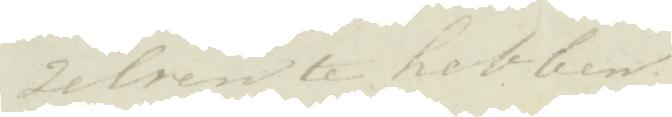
zelven te hebben
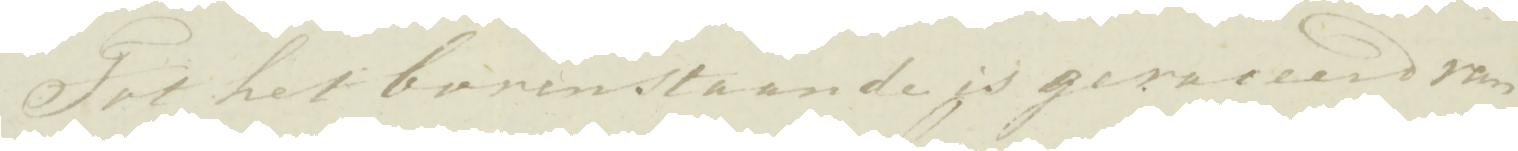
Tot het bovenstaande is gevaceerd van
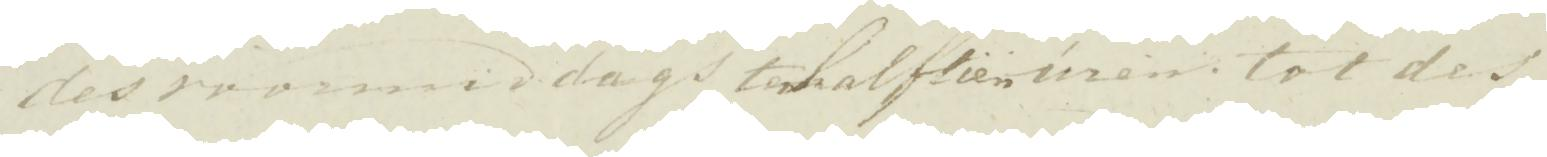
des voormiddags ten halftien uren tot des
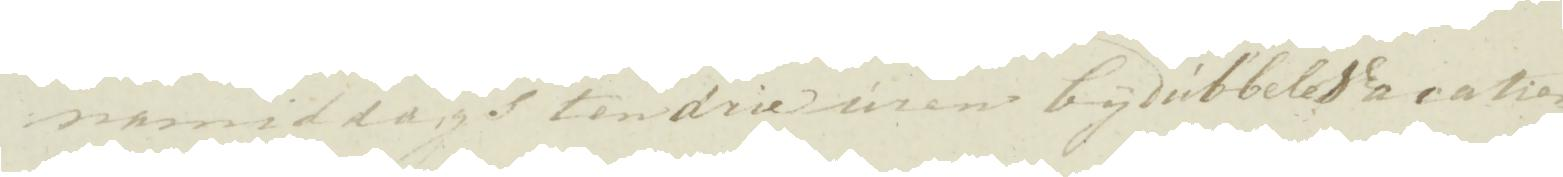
namiddags ten drie uren bij dubbele Vacatie
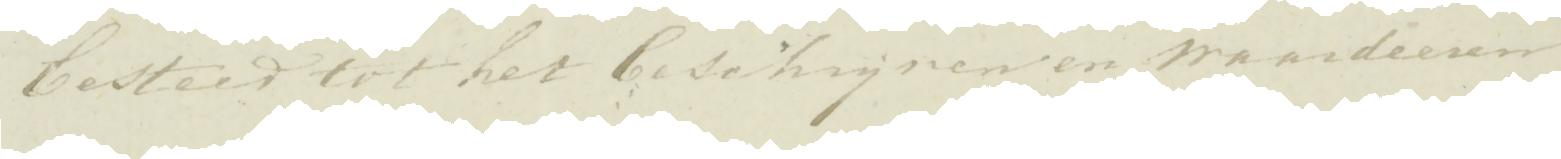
besteed tot het beschrijven en waardeeren
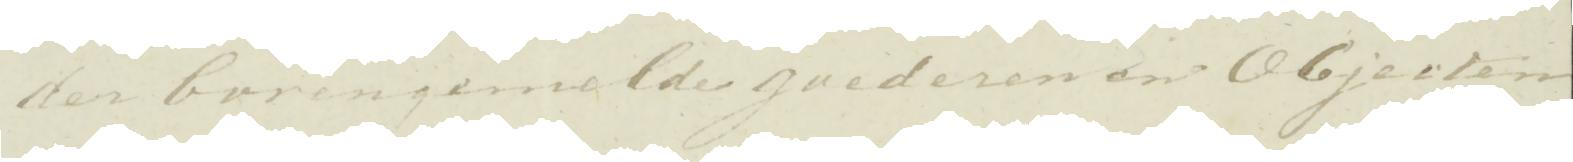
der bovengemelde goederen en Objecten
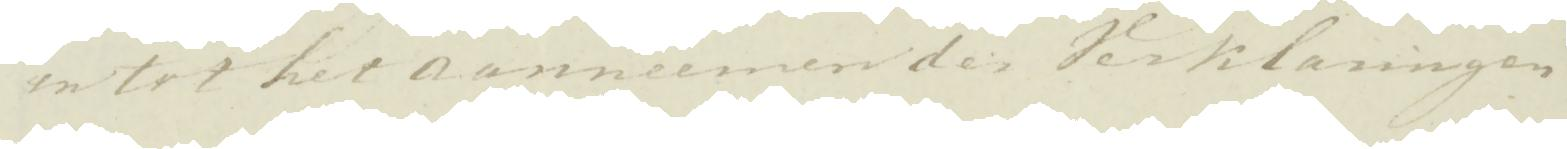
en tot het aanneemen der Verklaringen
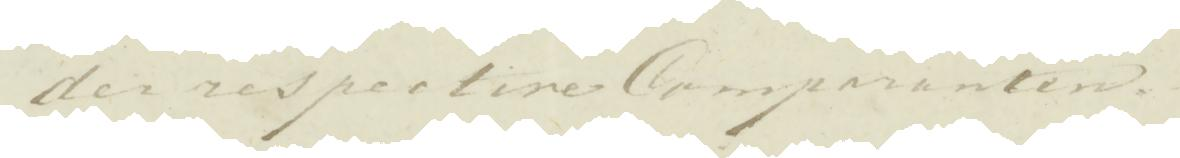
der respective Comparanten.
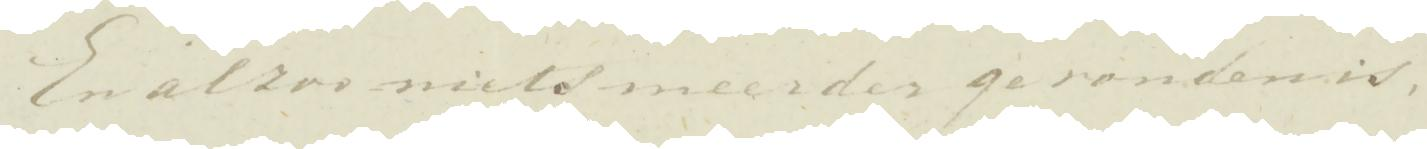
En alzoo niets meerder gevonden is,
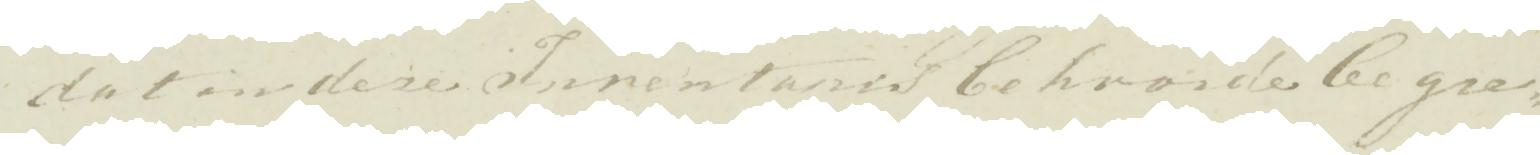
dat in deze Inventaris behoorde begre
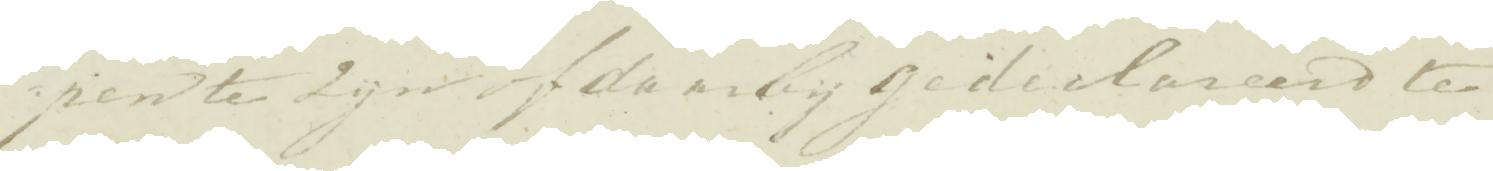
„pen te zijn of daar bij gedeclareerd te
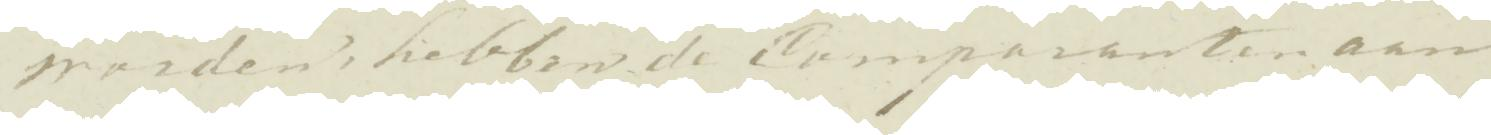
worden, hebben de Comparanten aan
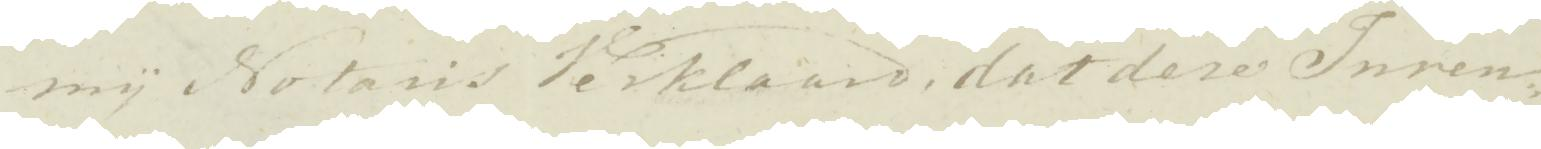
mij Notaris Verklaard, dat deze Inven
